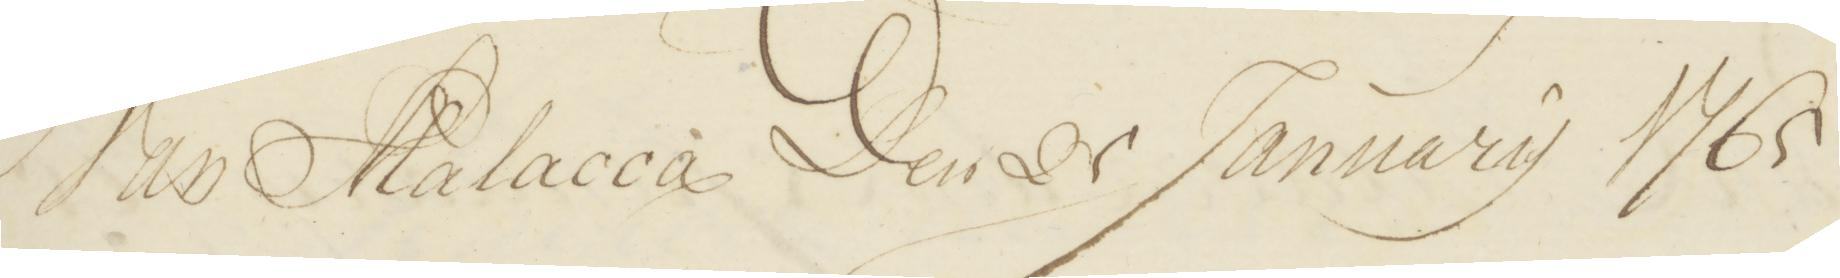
Van Malacca Den 25 Januarij 1765
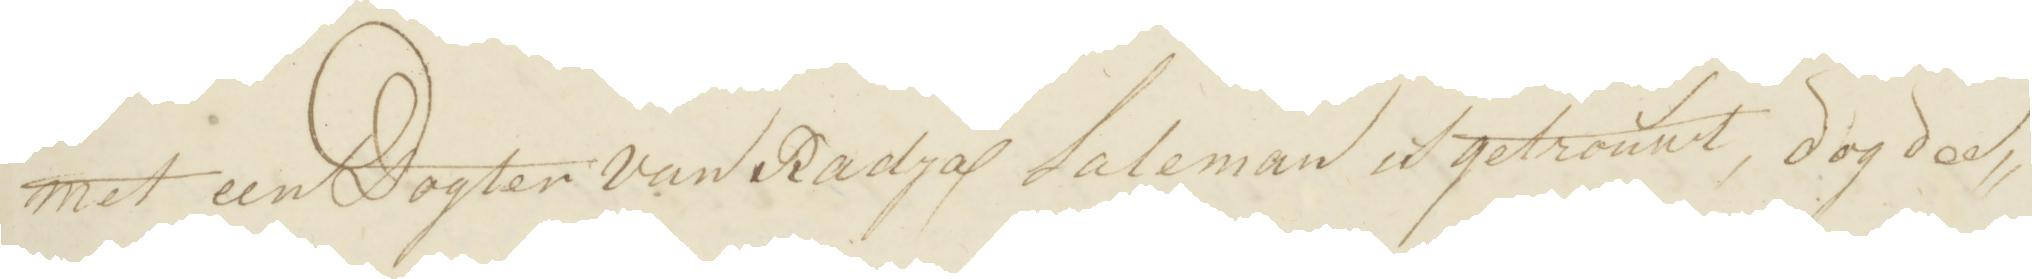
met een Dogter van Radja Saleman is getrouwt, dog doe„
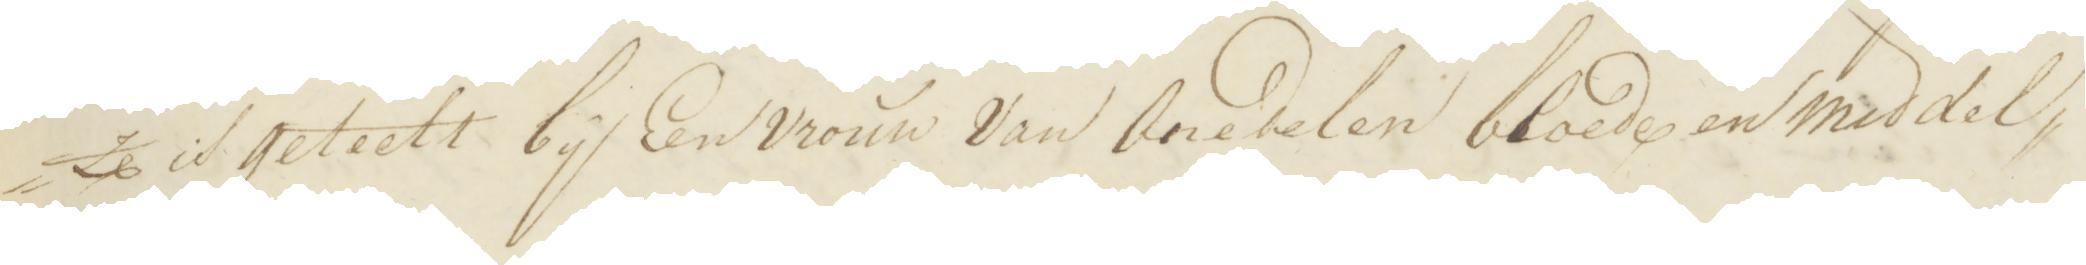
„ze is geteelt bij Een vrouw van Onedelen bloede en middel„
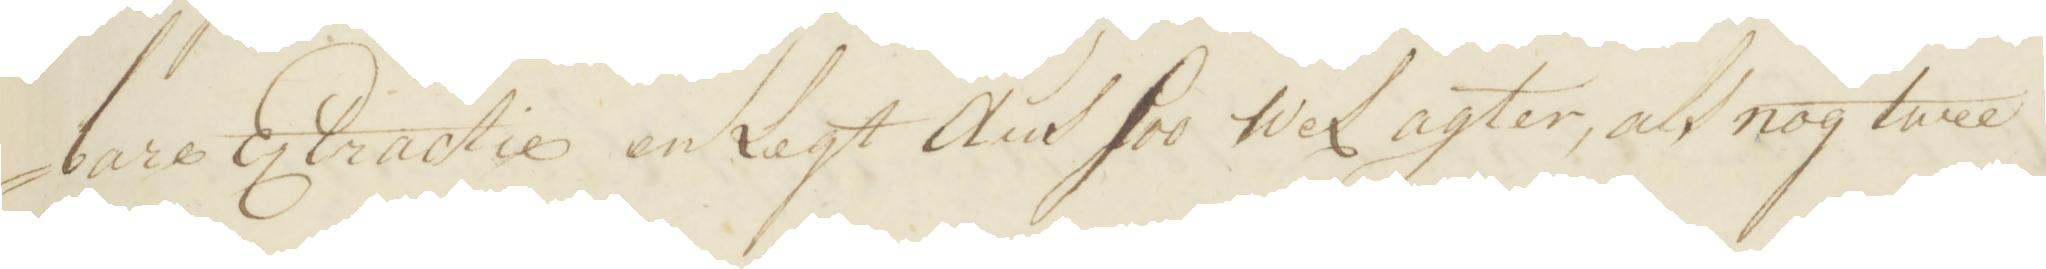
„bare Extractie en Legt dus soo wel agter, als nog twee
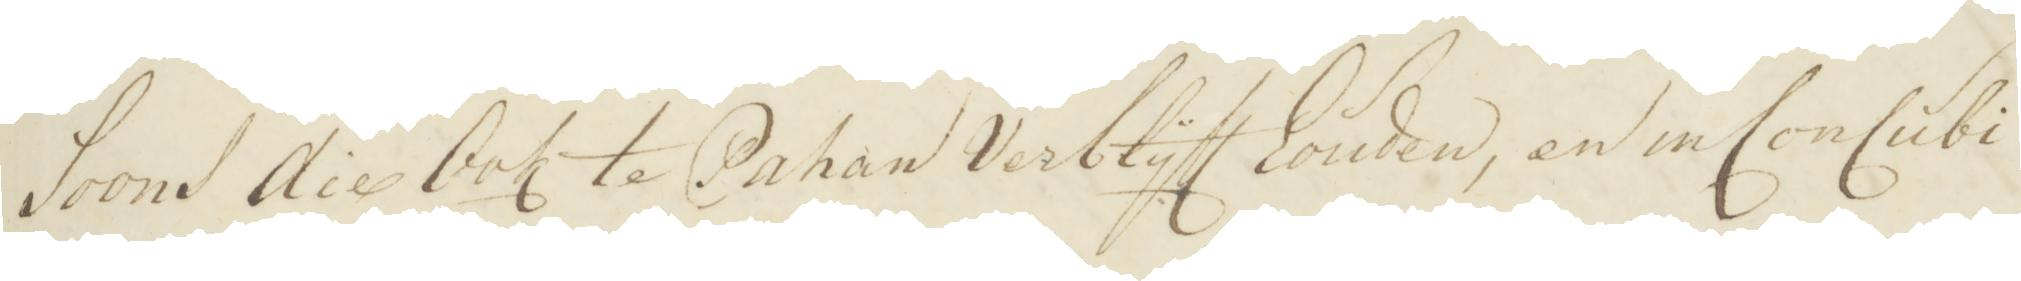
soons die Ook te Pahan verblijff houden, en in Concubi
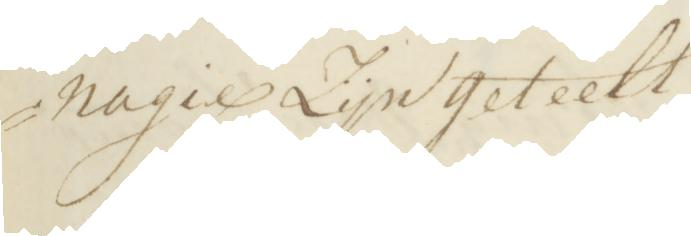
„nagie zijn geteelt
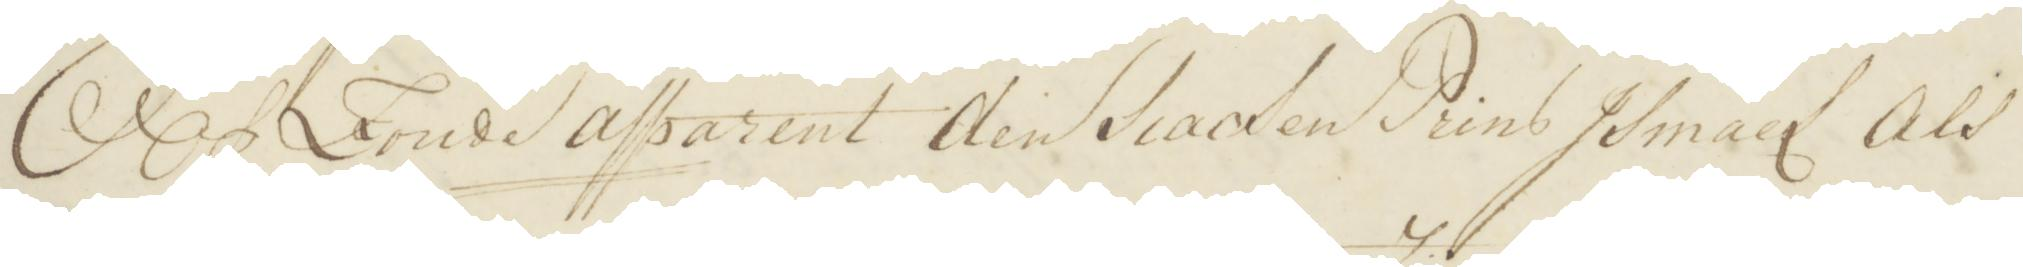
Ook zoude apparent den Siaden Prins Jsmael als
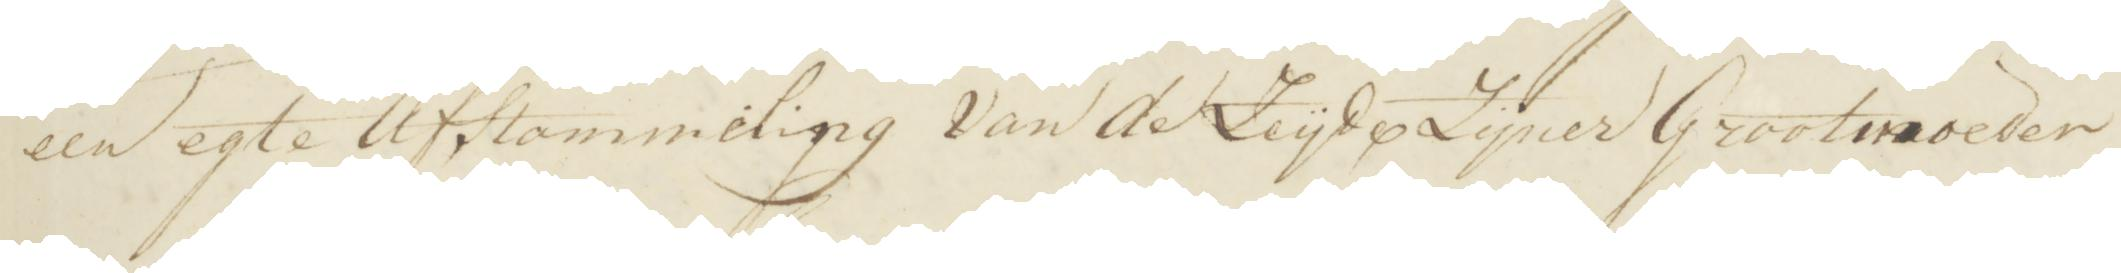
een egte Afstammeling van de Zeijde zijner Grootmoeder
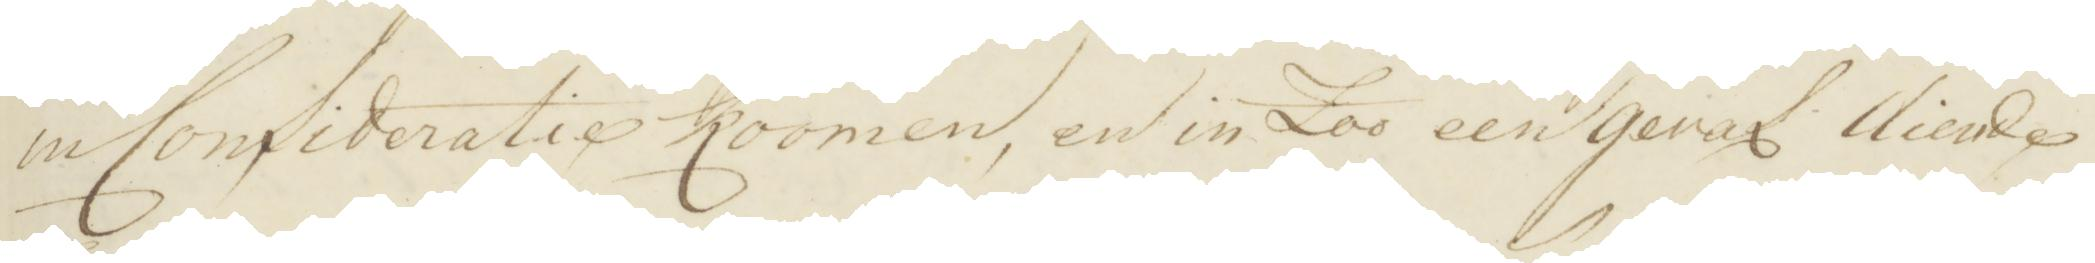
in Consideratie koomen, en in Zoo een geval diende
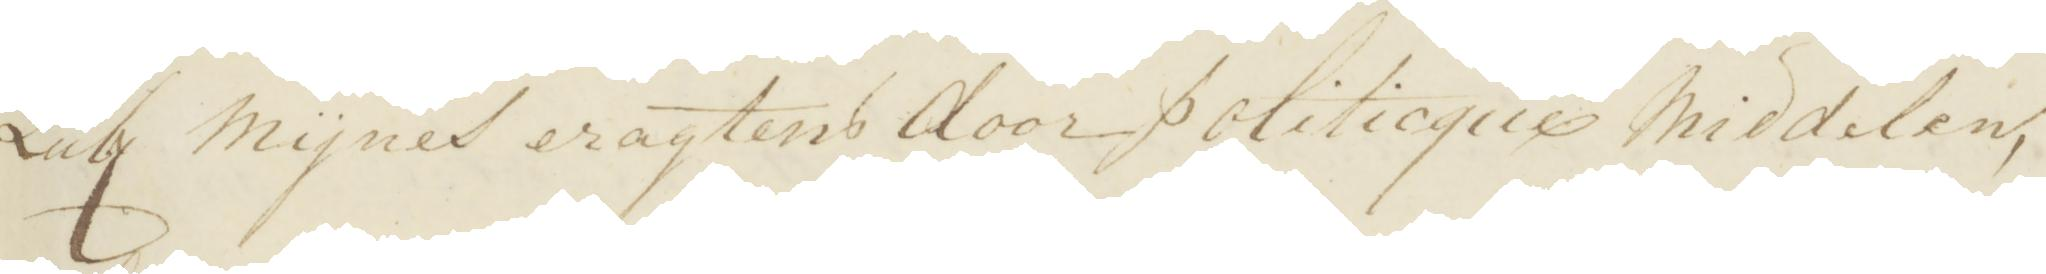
zulx mijnes eragtens door politicque middelen,
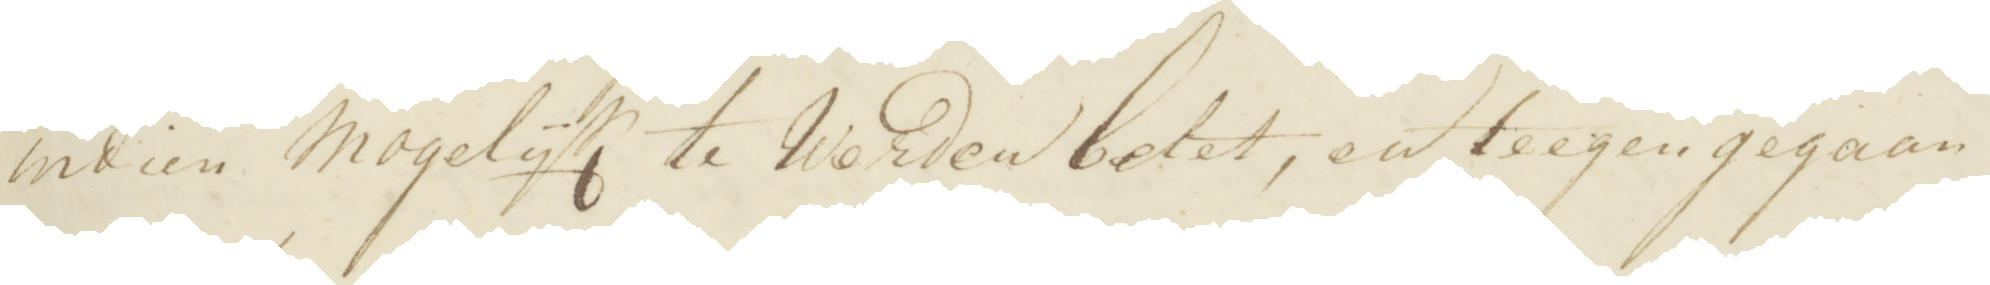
indien mogelijk te werden belet, en teegen gegaan
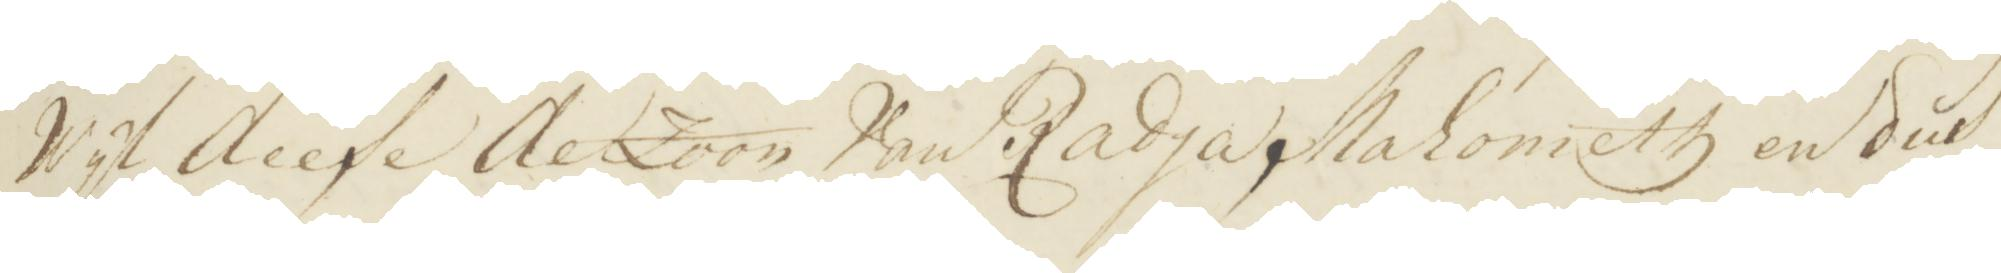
wijl deese de zoon van Radja, Mahometh en dus
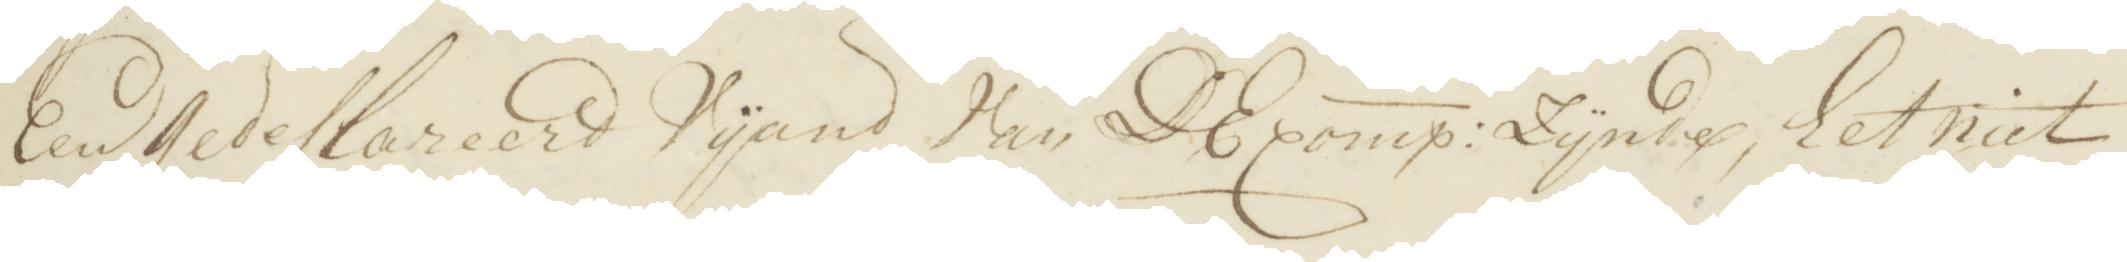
Een gedeclareerd Vijand Van D E Comp: zijnde, het niet
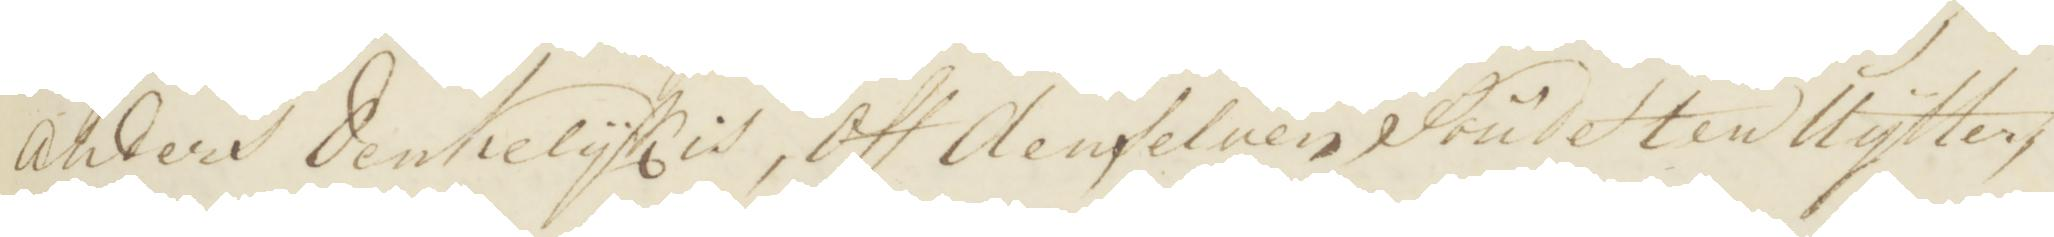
anders denkelijk is, off denselven soude ten Uijtter,
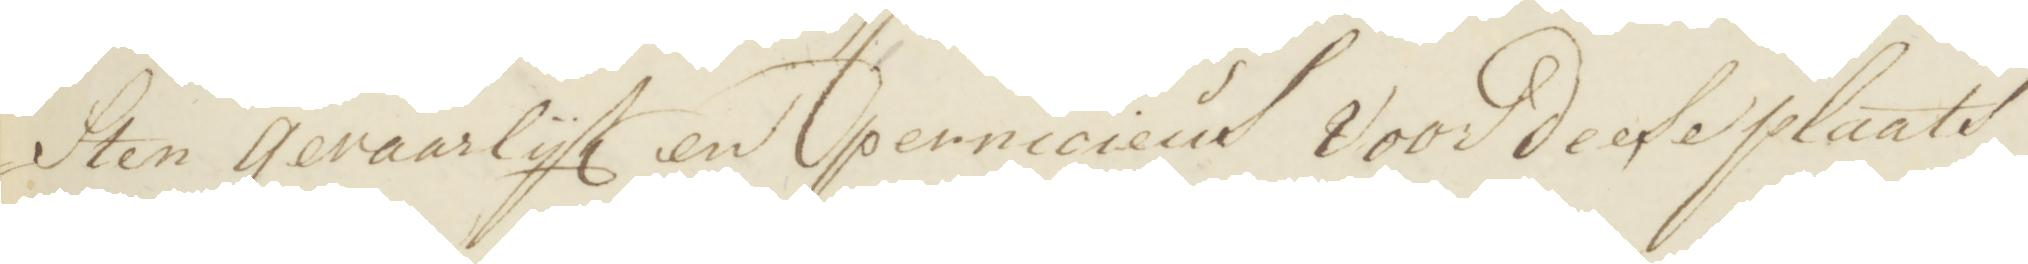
„sten gevaarlijk en pernicieus voor deese plaats
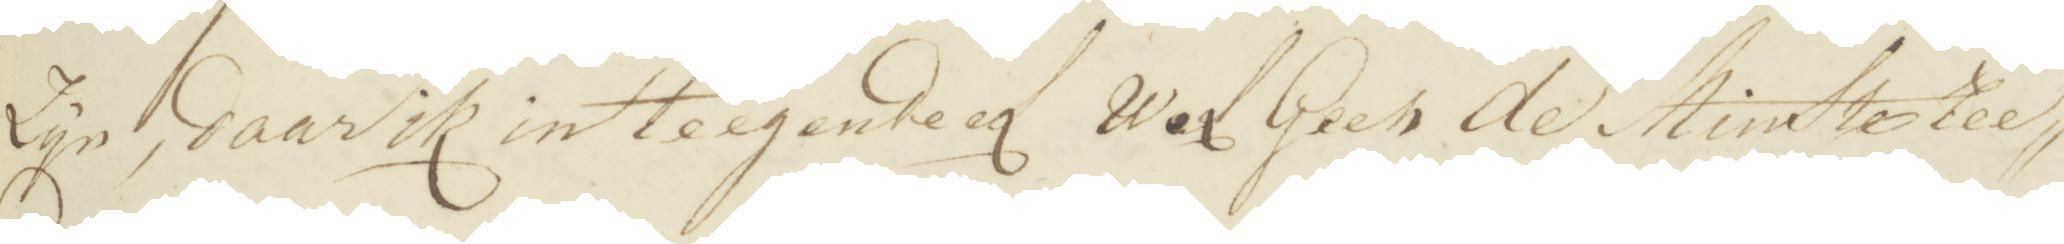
zijn, daar ik in teegendeel wel Geen de Minste zee„
